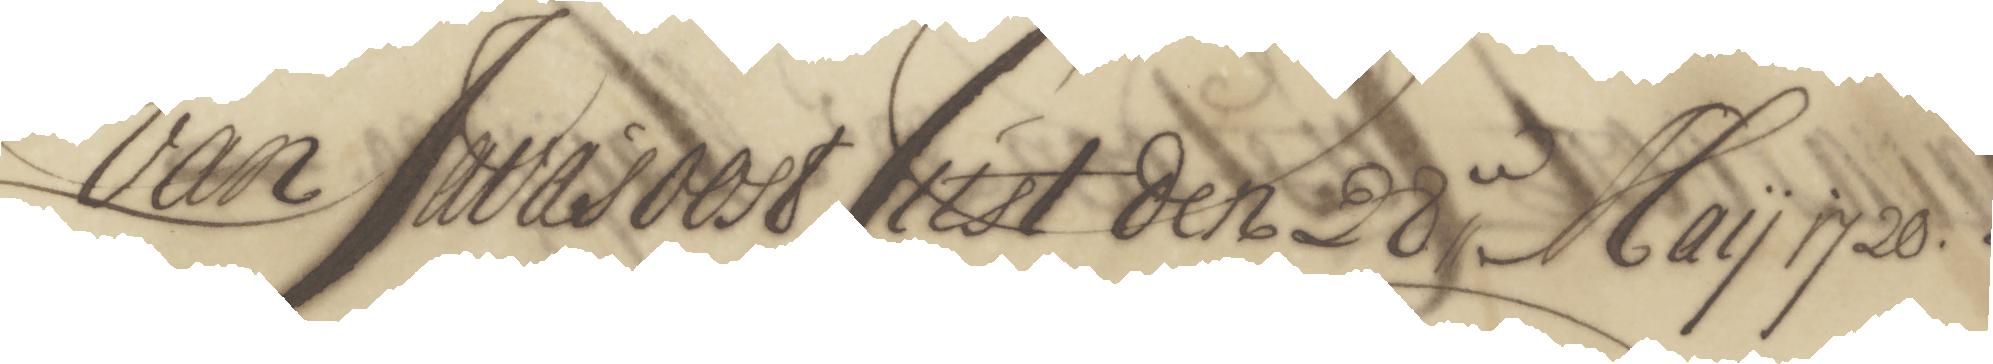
Van Java's oost Cust den 28„e Maij 1720.
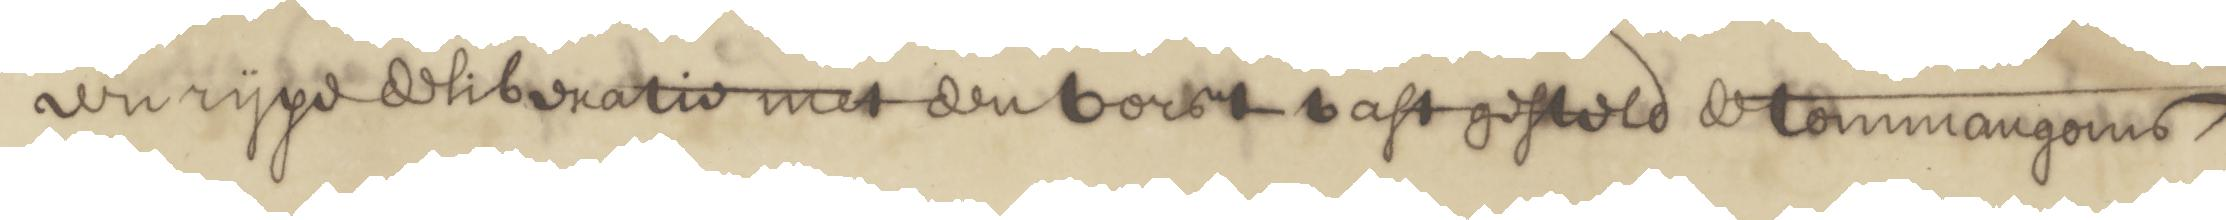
een rijpe deliberatie met den vorst vast gesteld de tommangoms
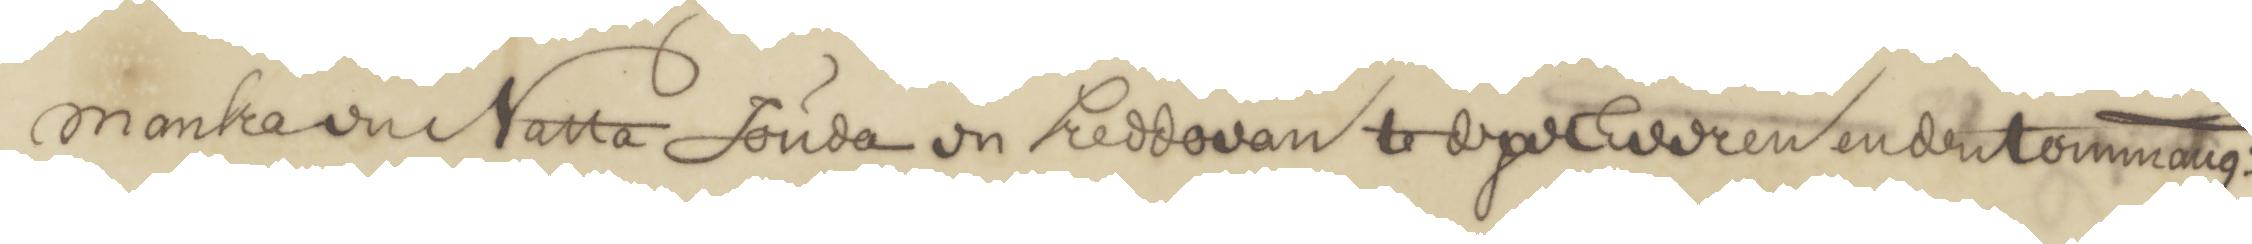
manka en Natta Jouda en keddovan te depecheeren en den tommang:
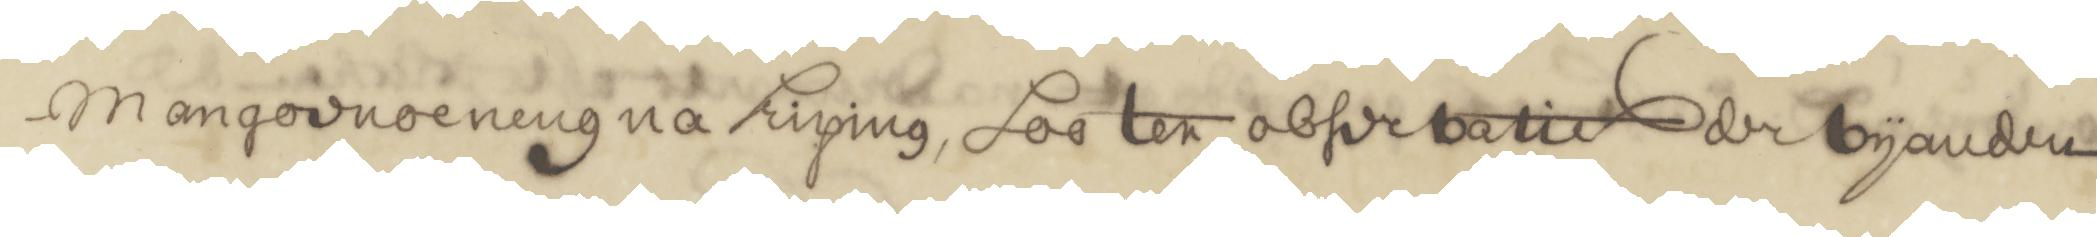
mangoenoeneng na kiping, soo ter observatie der vijanden
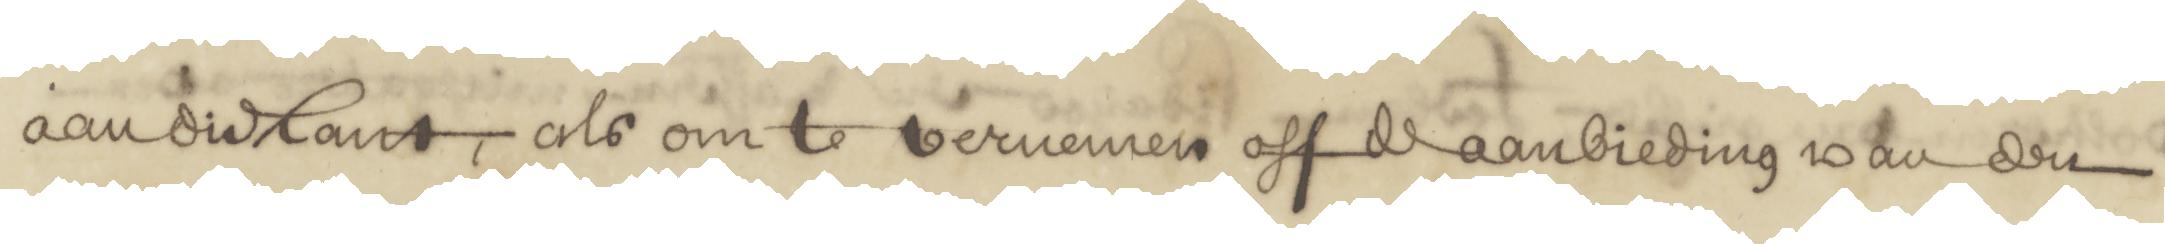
aan die kant, als om te vernemen off de aanbieding van den
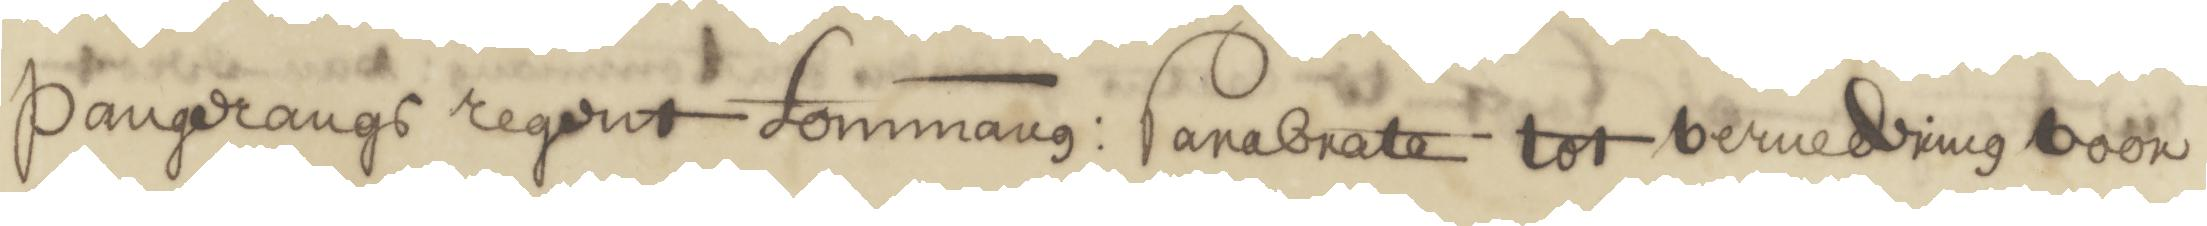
Pangerangs regent Tommang: sarabrata tot vernedering voor
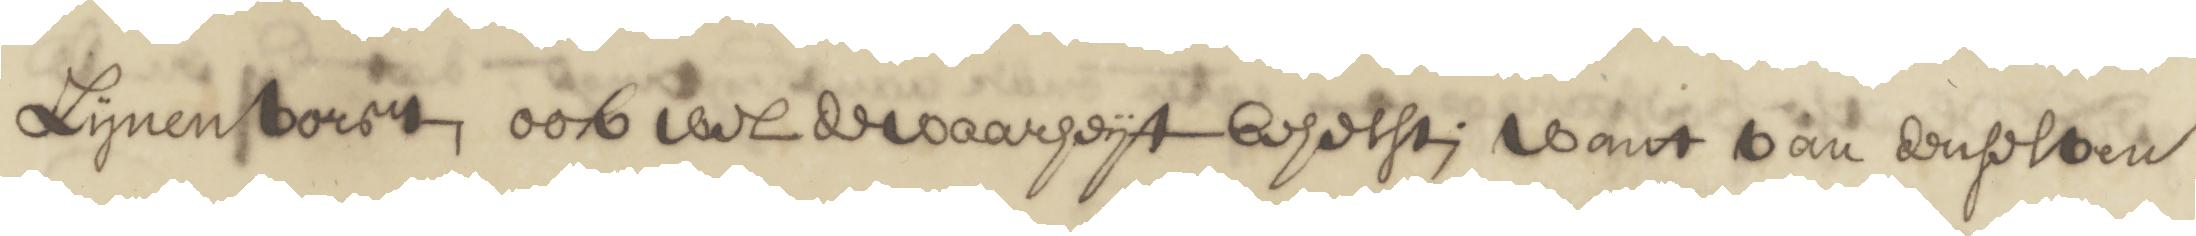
zijnen vorst, ook wel de waarheijt behelft; want van denselven
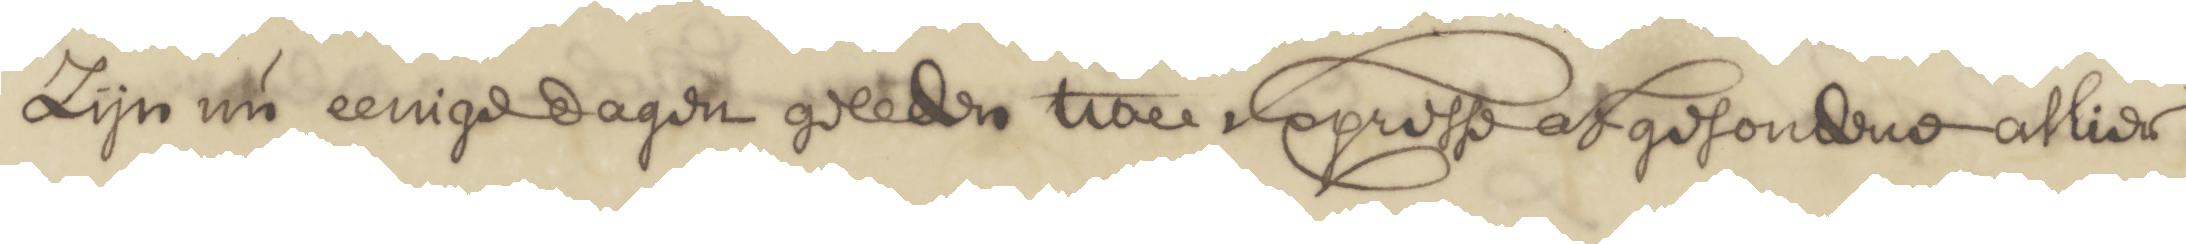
zijn nu eenige dagen geleden twee Expresse afgesondene alhier
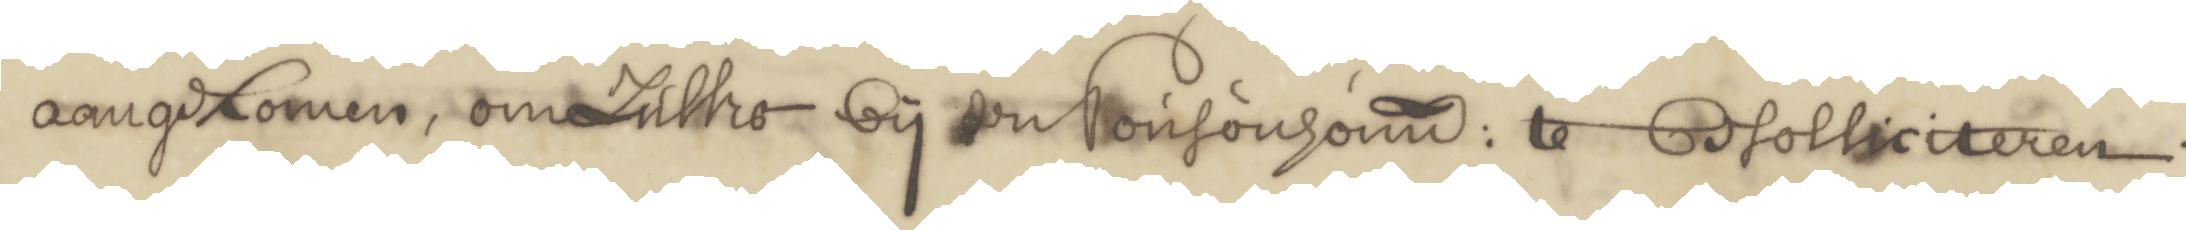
aangekomen, om zulks bij den sousouhoun: te besolliciteren
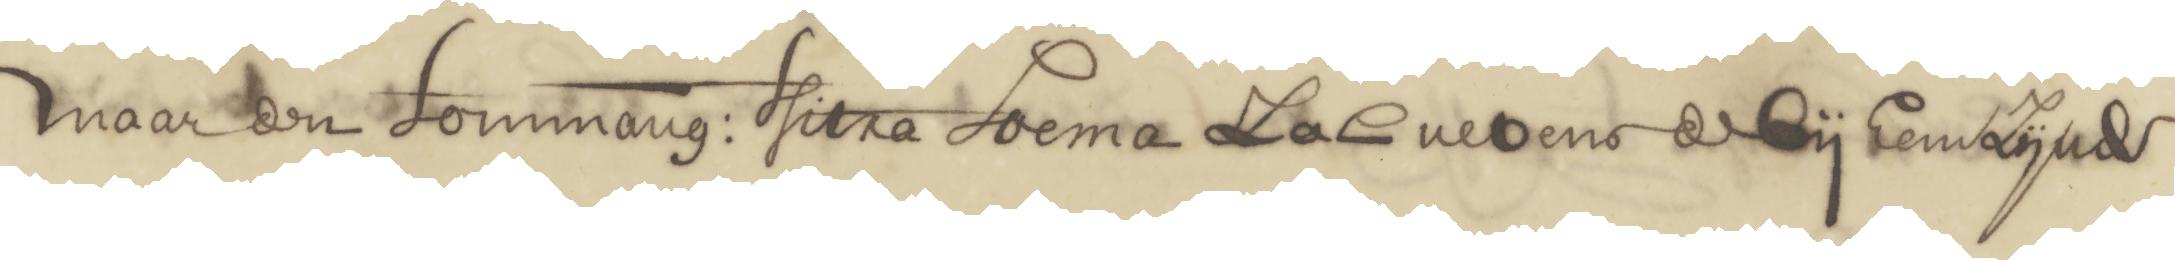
maar den Tommang: Tsitra Soema zal nevens de bij hem zijnde
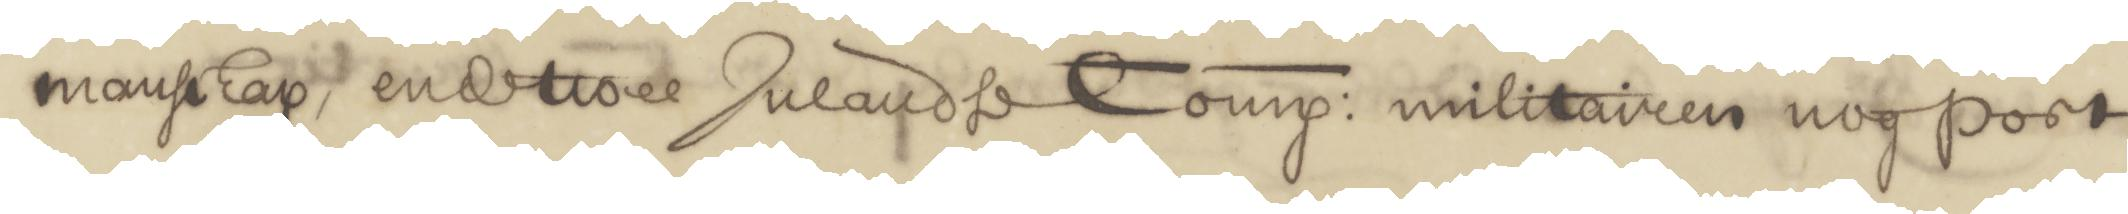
manschap, ende twee Jnlandse Comp: militairen nog post
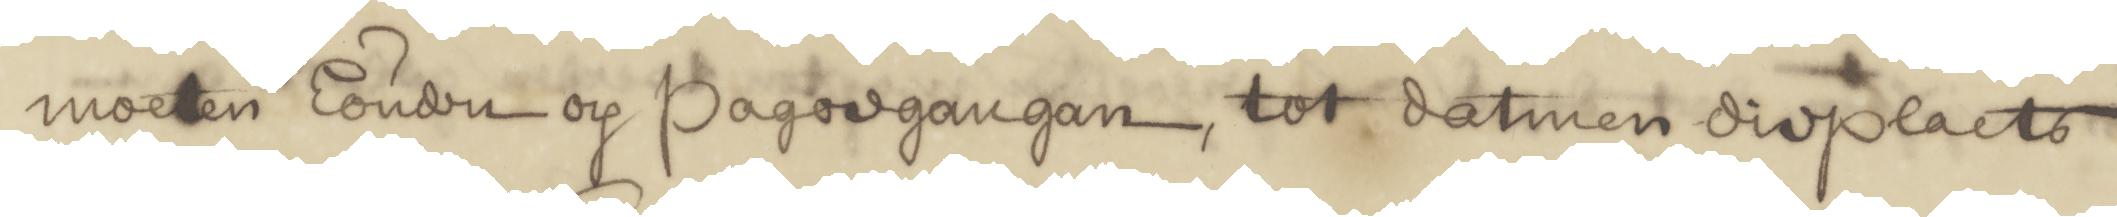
moeten houden op Pagoegangan, tot dat men die plaets
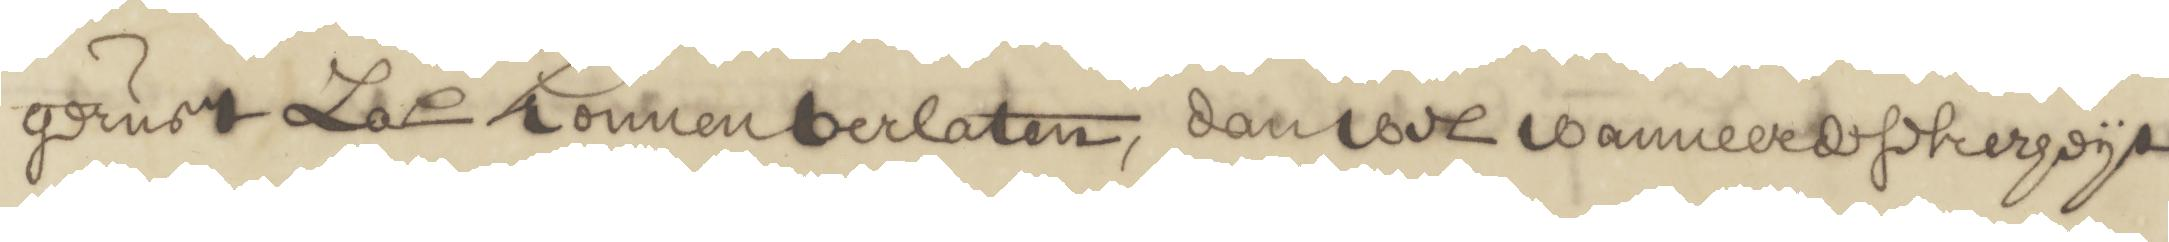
gerust zal konnen verlaten, dan wel wanneer de sekerheijt
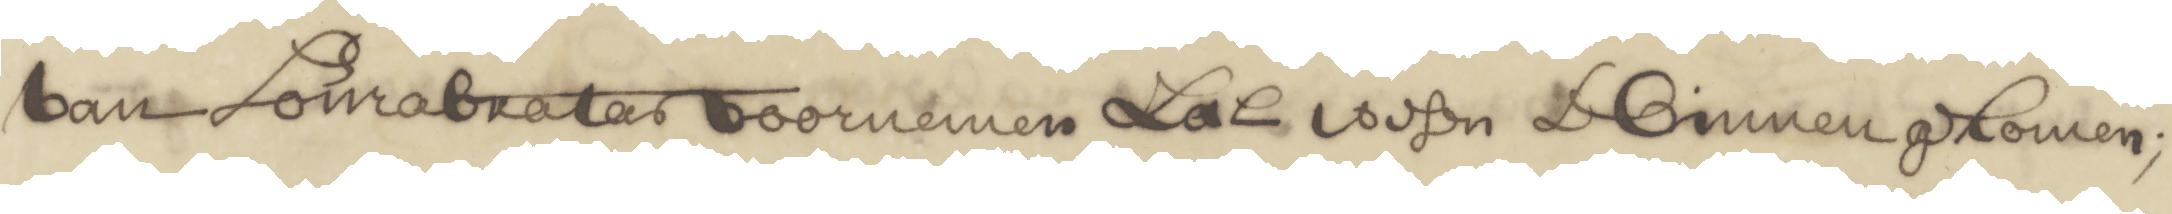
van sourabratas voornemen zal wesen te binnen gekomen
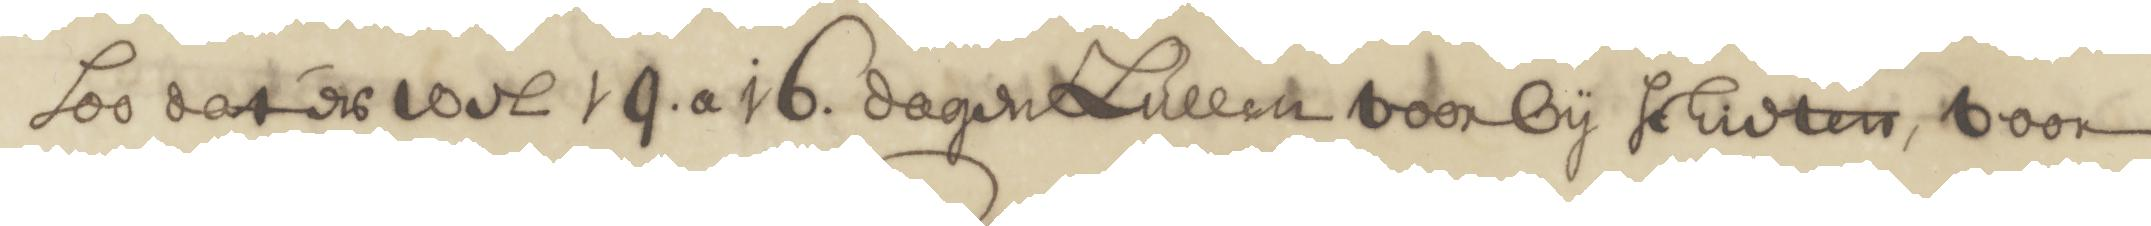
soo dat 'er wel 14. a 16. dagen zullen voorbij schieten, voor
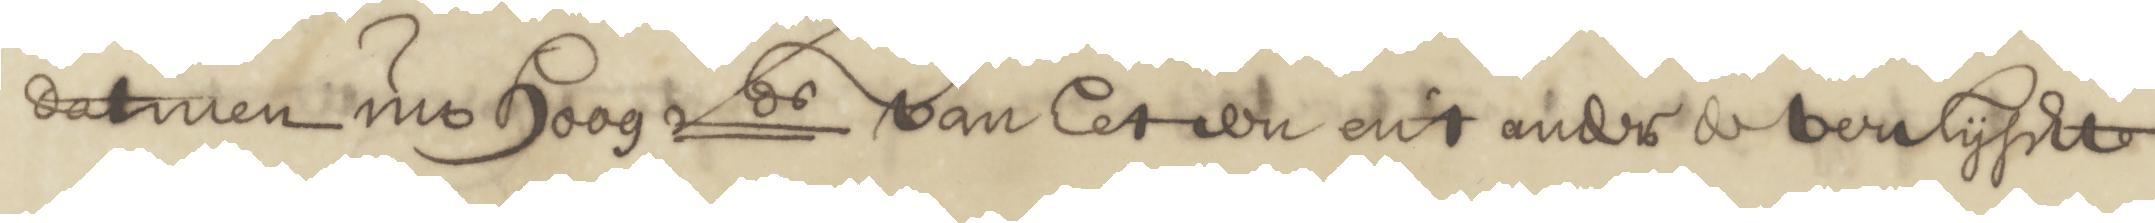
dat men uw Hoog E=ds van het een en ’t ander de verEijschte
